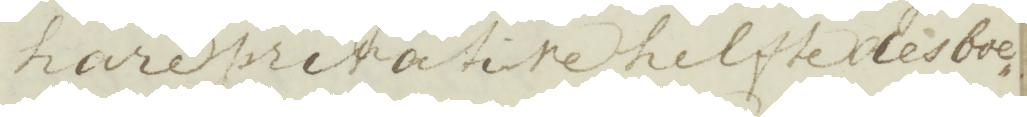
hare privative helfte des boe„
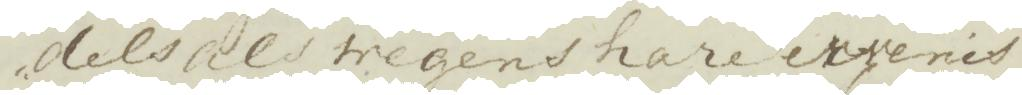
„dels als wegens hare ervenis
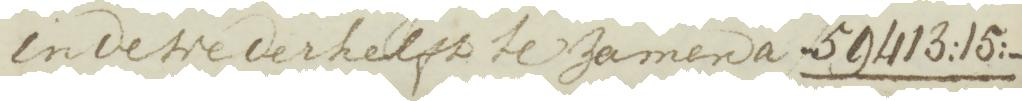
en de wederhelft te zamen a ƒ59413:15:
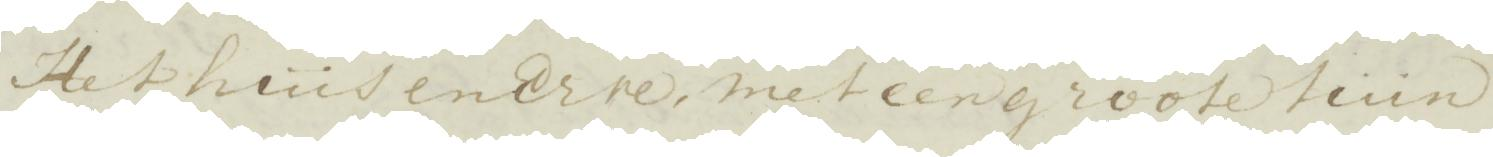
Het huis en Erve, met een groote tuin
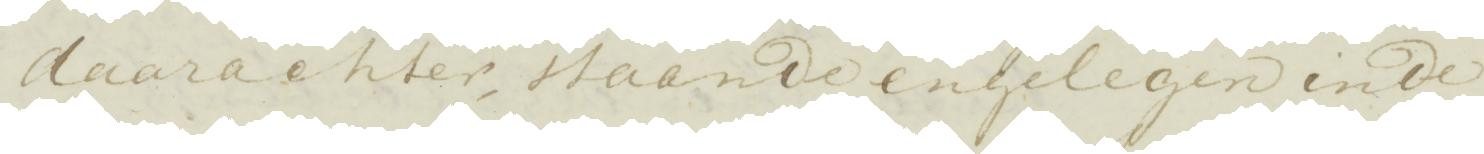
daarachter, staande en gelegen in de
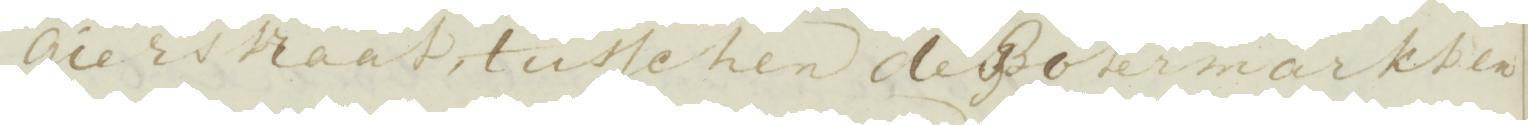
gierstraat, tusschen de Botermarkten
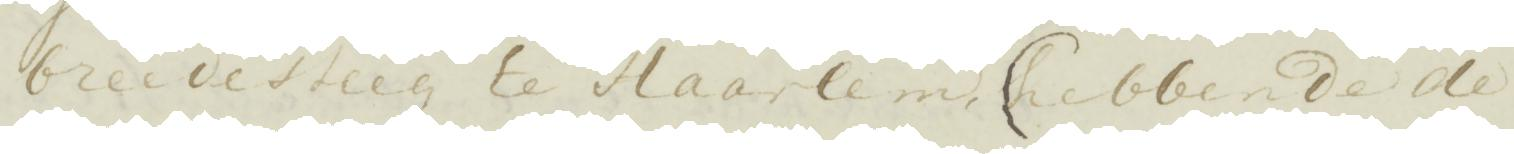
breedesteeg te Haarlem, (hebbende de
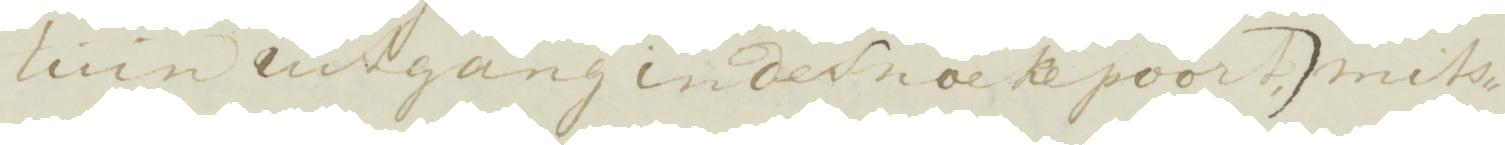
tuin uitgang in de snoekepoort,) mits„
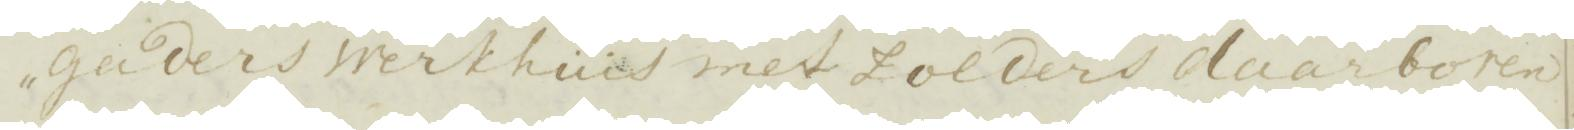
„gaders werkhuis met zolders daarboven
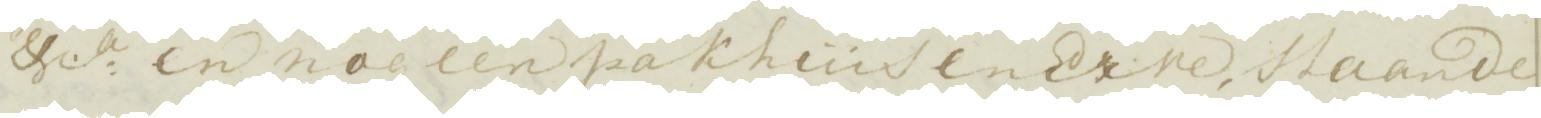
&c=a en nog een pakhuis en Erve, staande
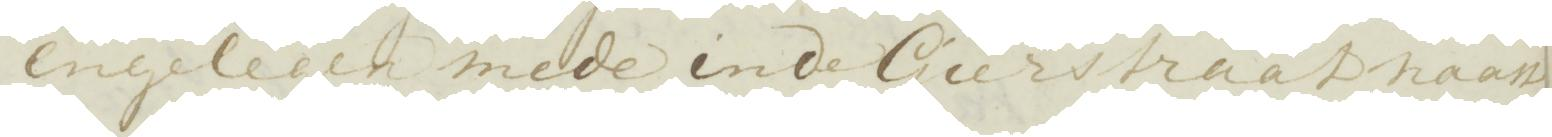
en gelegen mede in de Gierstraat naar
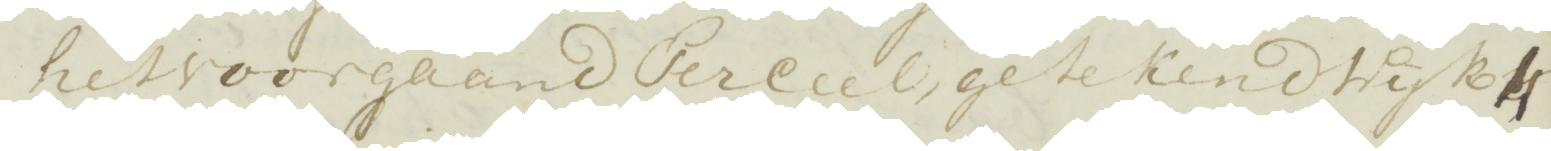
het voorgaand Perceel, getekend Wijk 4
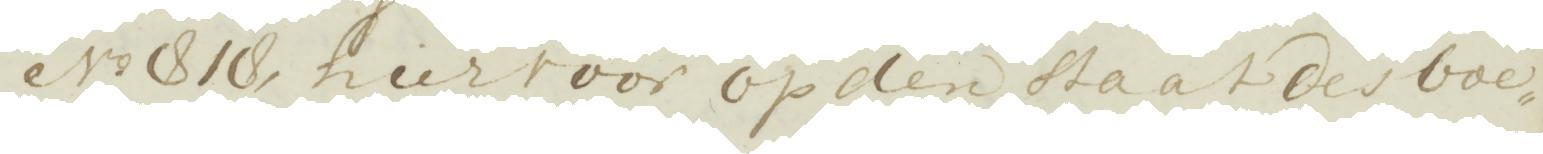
N-o 818, hiervoor op den staat des boe„
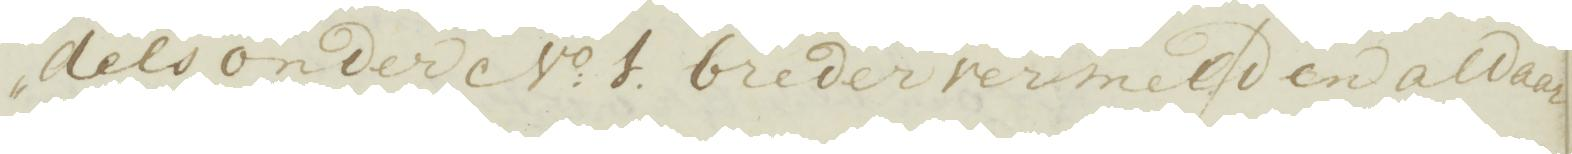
„dels onder N:o 1. breder vermeld en aldaar
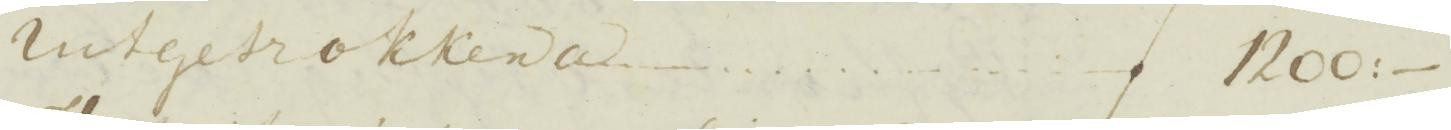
uitgetrokken a . . . . . . . . . . . . . . . . . . ƒ 1200:—
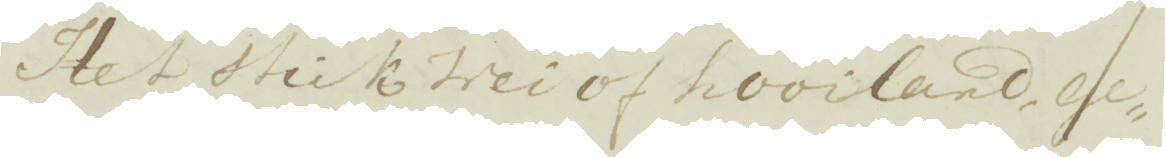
Het stuk wei of hooiland, ge„
